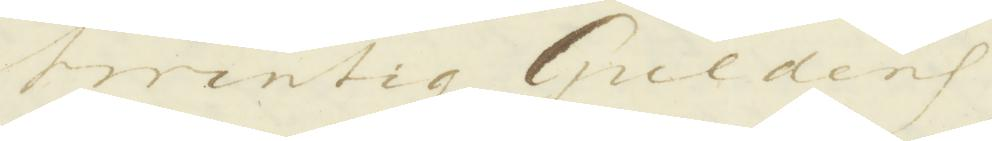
twintig Guldens
